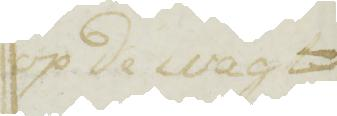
op de wagt
